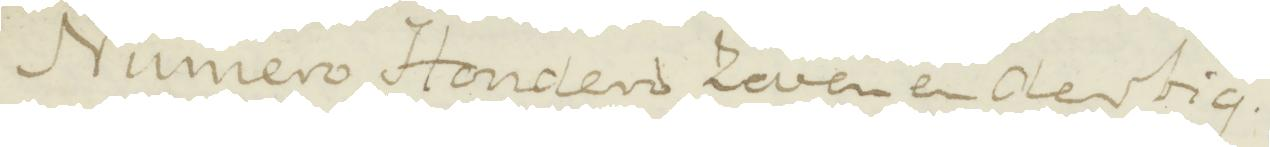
Numero Honderd zeven en dertig
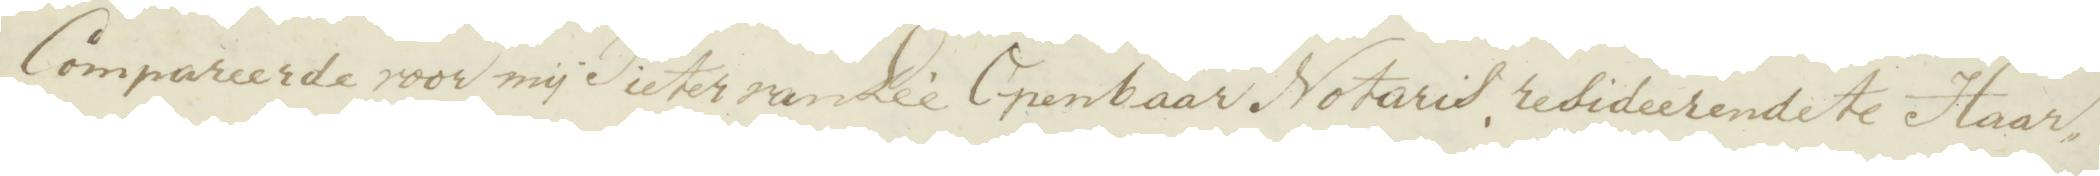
Compareerde voor mij Pieter van Leé Openbaar Notaris, resideerende te Haar„
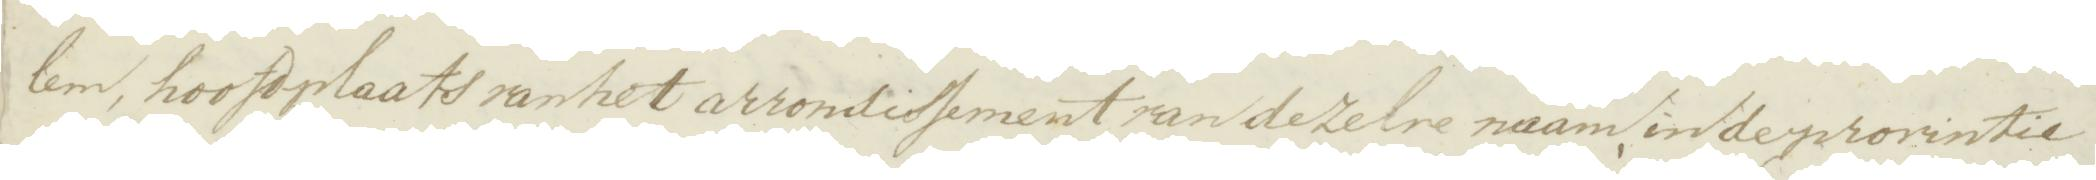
lem, hoofdplaats van het arronsissement van dezelve naam, in de provintie
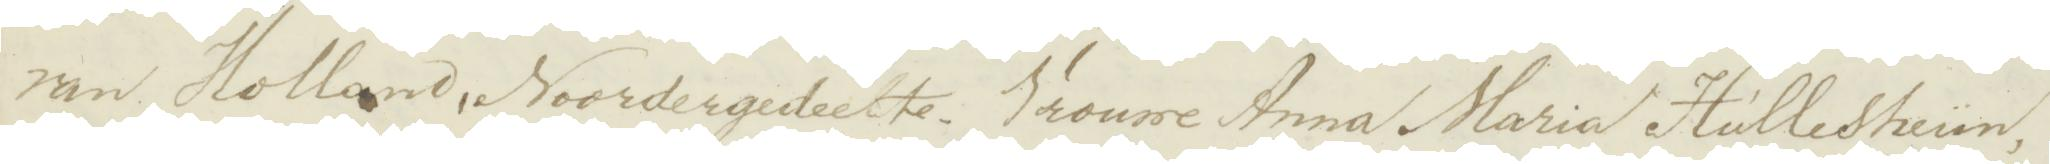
van Holland, Noordergedeelte. Vrouwe Anna Maria Hullesheün,
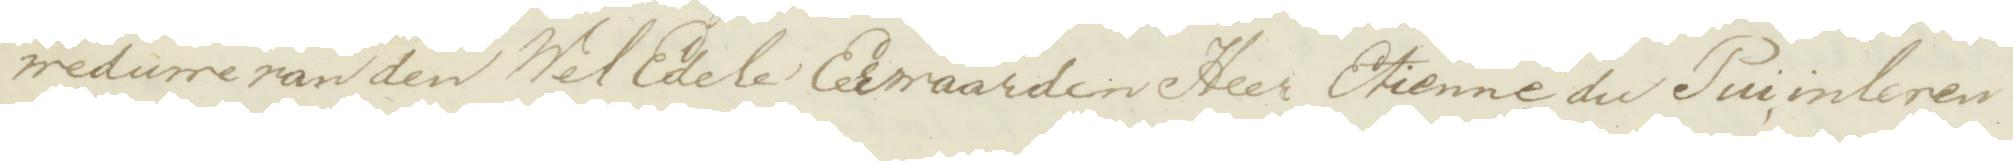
weduwe van den Wel Edele Erwaarden Heer Etienne du Pui, inleven
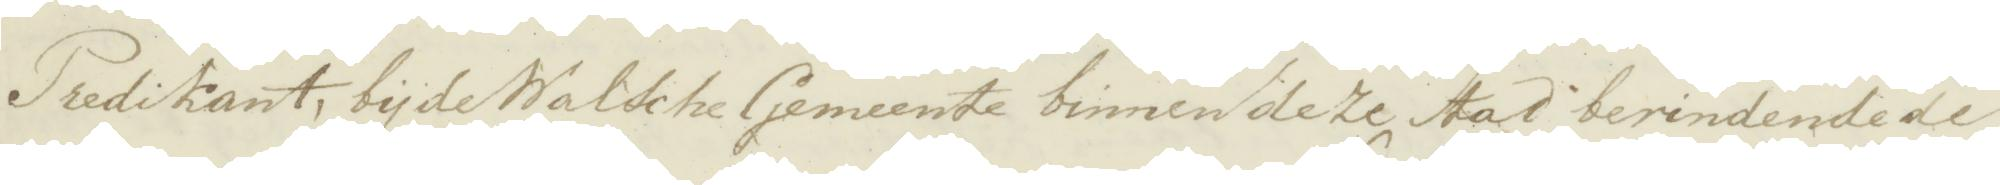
Predikant, bij de Walsche Gemeente binnen deze stad bevindende de
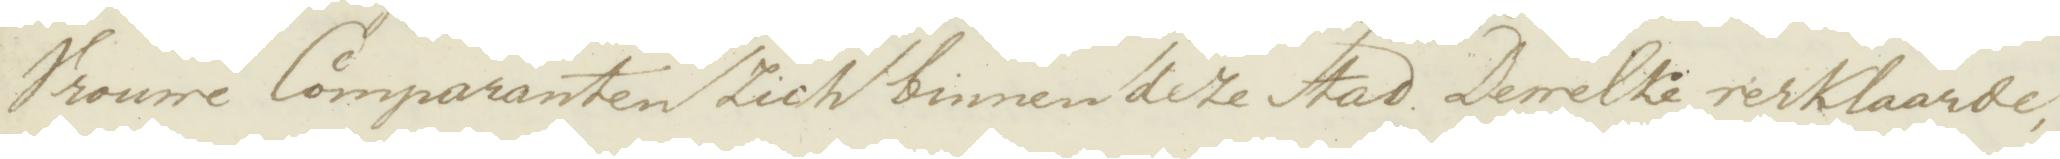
Vrouwe Comparanten zich binnen deze Stad. Dewelke verklaarde,
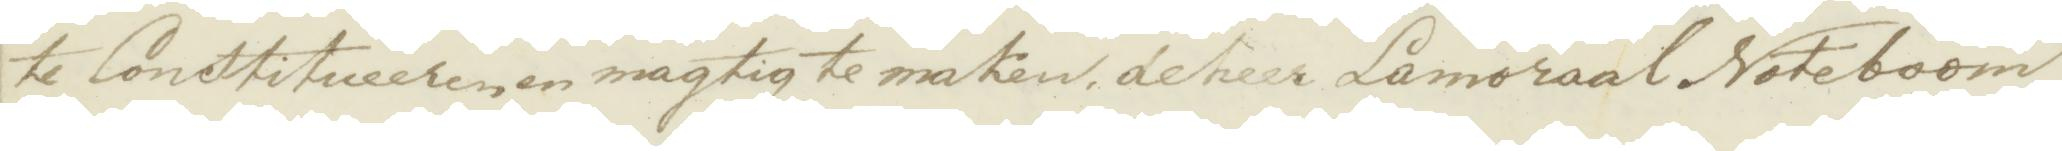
te Constitueeren en magtig te maken, de heer Lamoraal Noteboom,
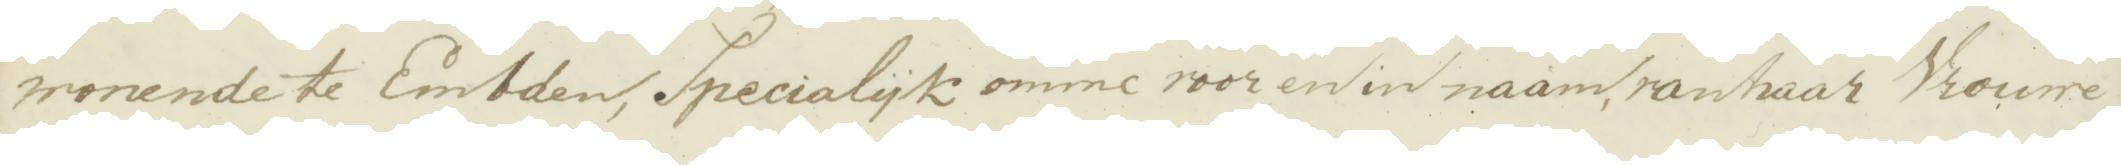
wonende te Emtden, Specialijk omme voor en in naam, van haar Vrouwe
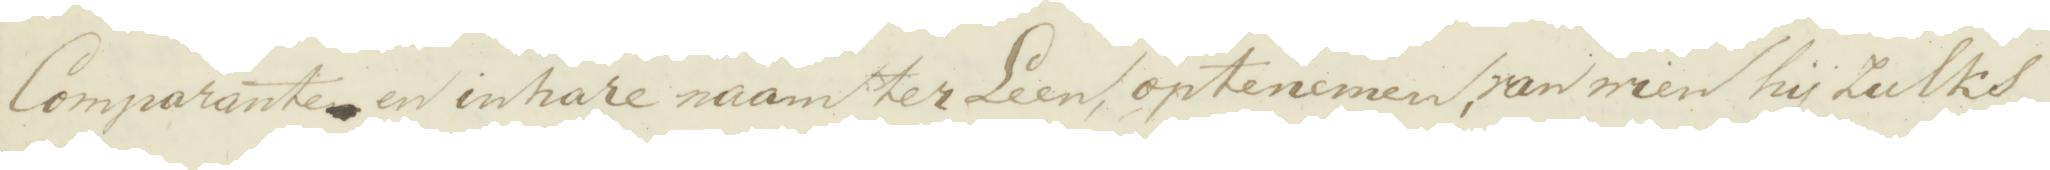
Comparanten en in hare naam ter Leen, optenemen, van wien hij zulks
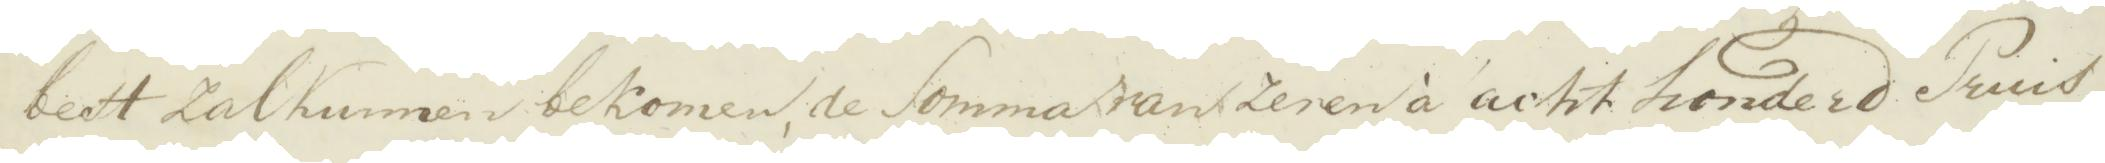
best zal kunnen bekomen, de somma van zeven à acht honderd Pruis
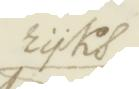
rijks
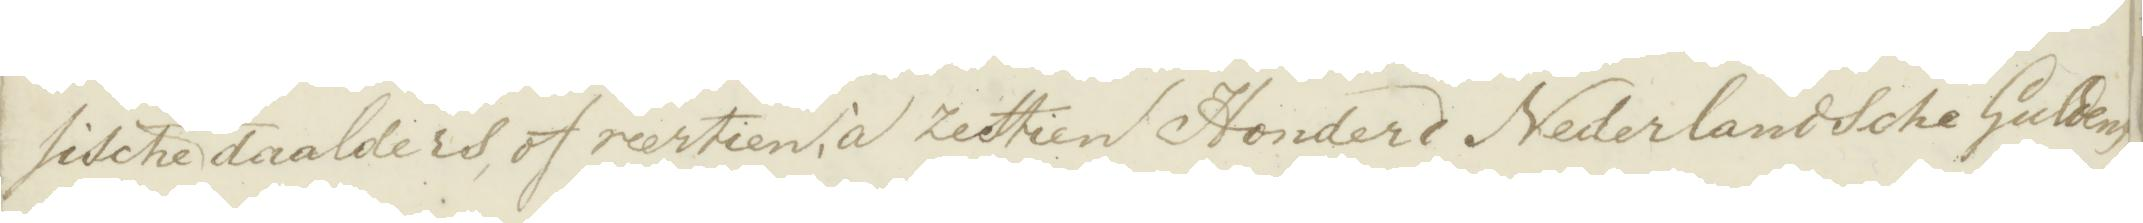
sische daalders, of veertien, à zestien Honderd Nederlandsche Guldens
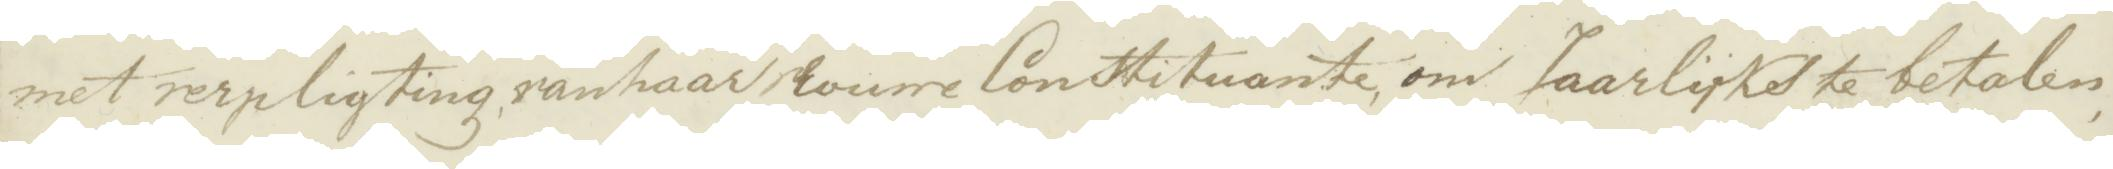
met verpligting van haar vrouwe Constituante, om Jaarlijks te betalen,
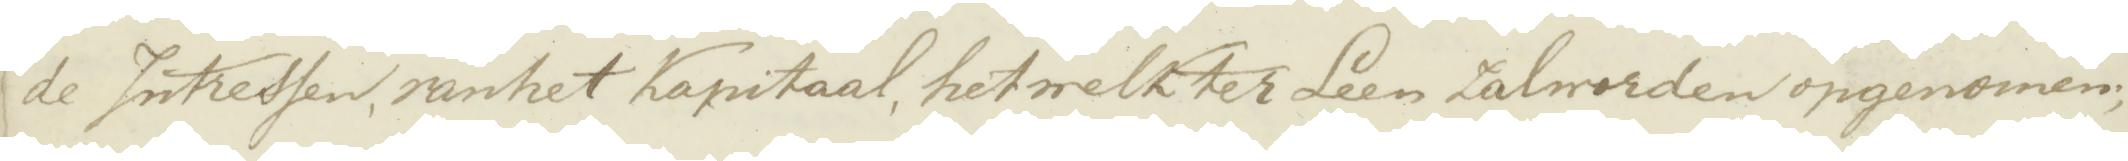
de Jntressen van het kapitaal, het welk ter Leen zal worden opgenomen
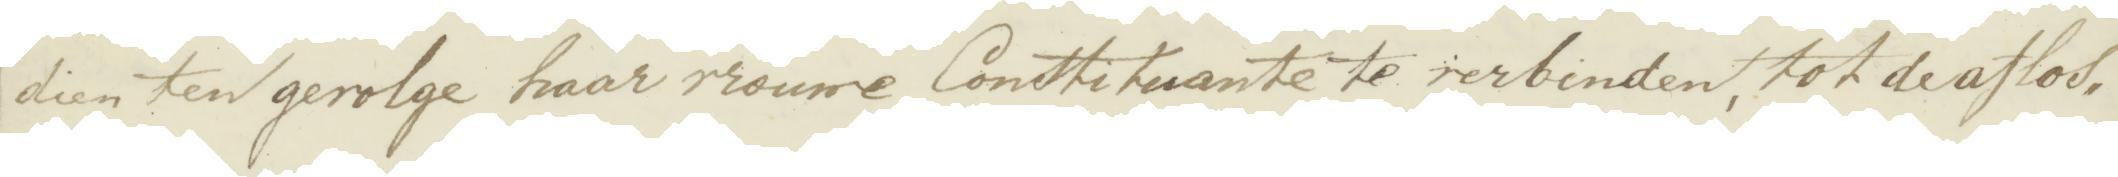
dien ten gevolge haar vrouwe Constituante te verbinden, tot de aflos„
